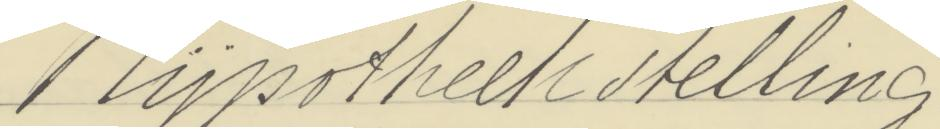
Hijpotheekstelling
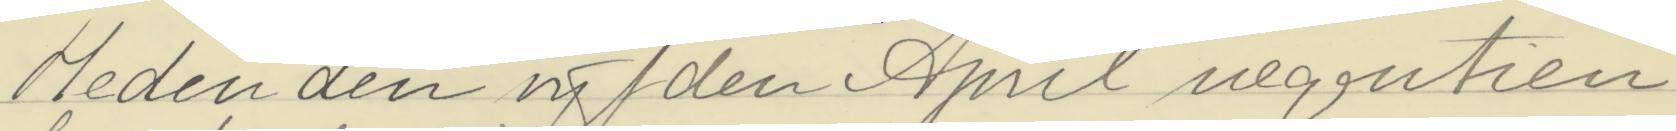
Heden den vijfden April negentien
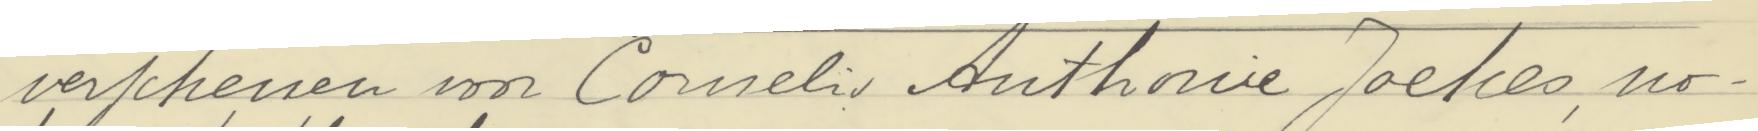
verschenen voor Cornelis Anthonie Joekes, no-
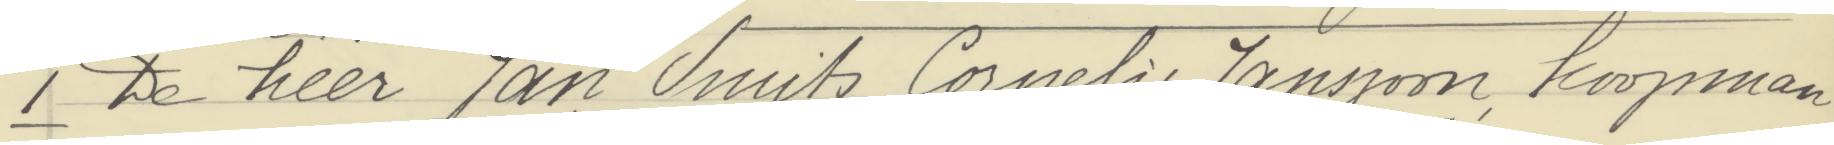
1 De heer Jan Smits Cornelis Janszoon, koopman
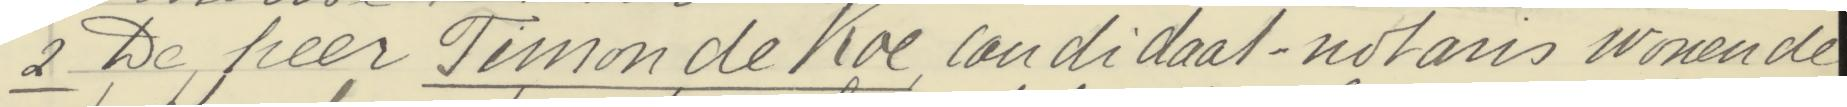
2 De heer Timon de Koe candidaat-notaris wonende
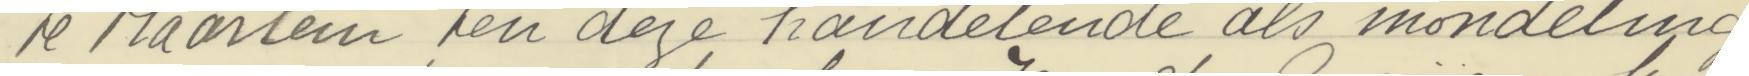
te Haarlem ten deze handelende als mondeling
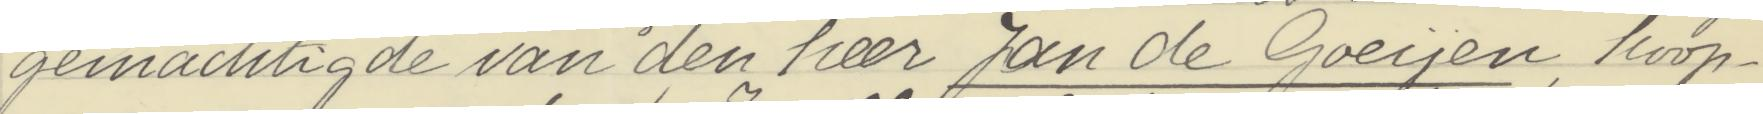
gemachtigde van den heer Jan de Goeijen, koop-
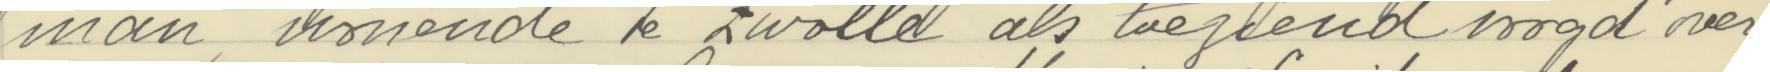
man, wonende te Zwolle als toeziend voogd over
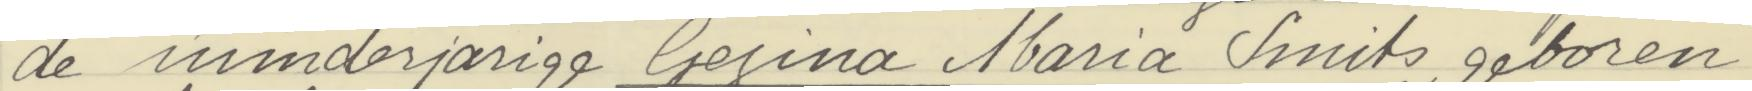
de minderjarige Gezina Maria Smits, geboren
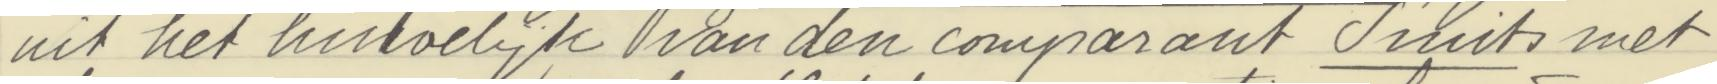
uit het huwelijk van den comparant Smits met
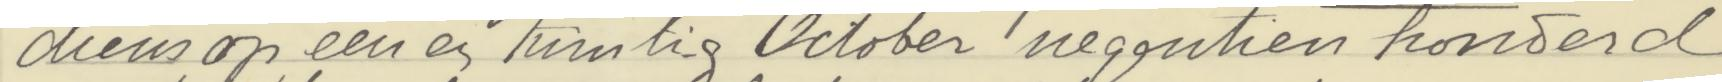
diens op een en twintig October negentien honderd
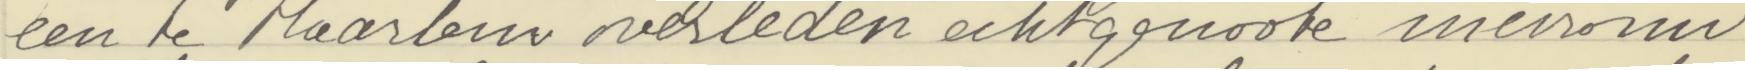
een te Haarlem overleden echtgenoote mevrouw
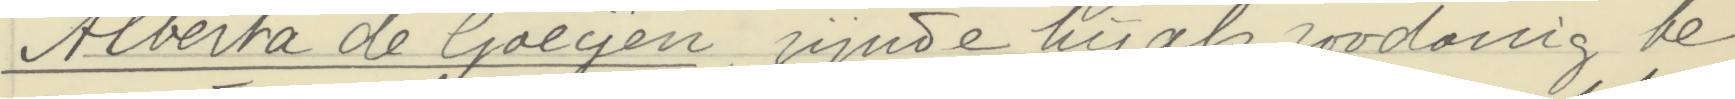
Alberta de Goeijen, zijnde hij als zoodanig be
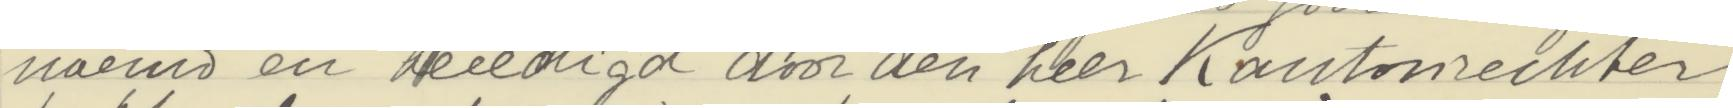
noemd en beëedigd door den heer Kantonrechter
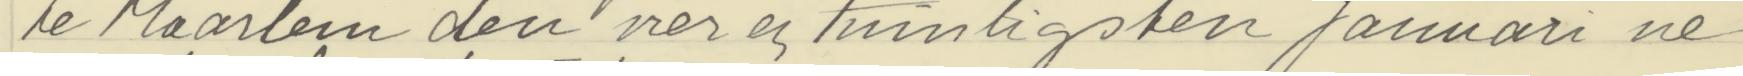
te Haarlem den vier en twintigsten Januari ne
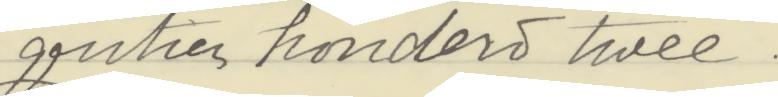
gentien honderd twee
